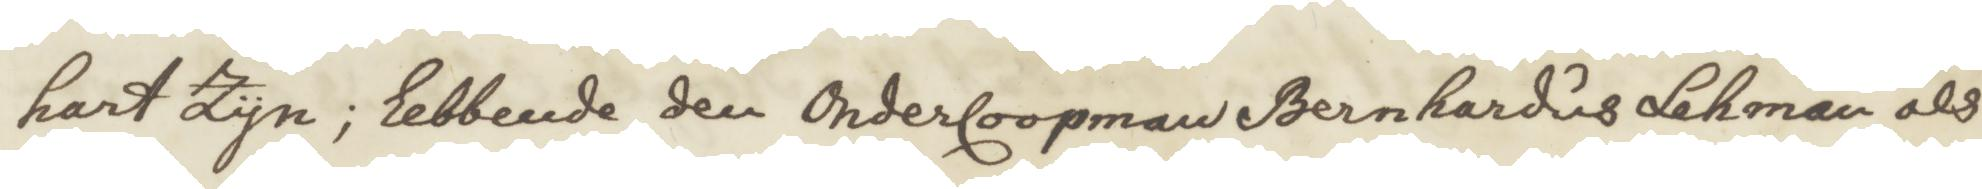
hart zijn; hebbende den ondercoopman Bernhardus Lehman als
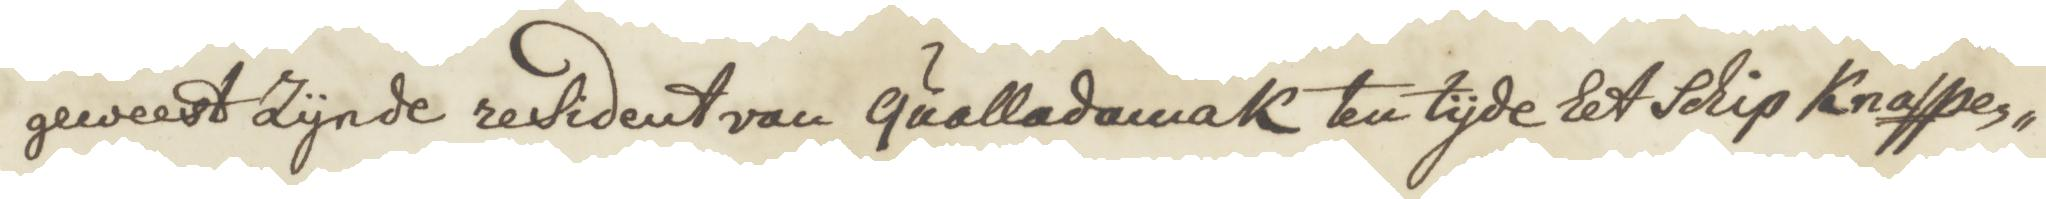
geweest zijnde resident van qualladamak ten tijde het schip knappen„
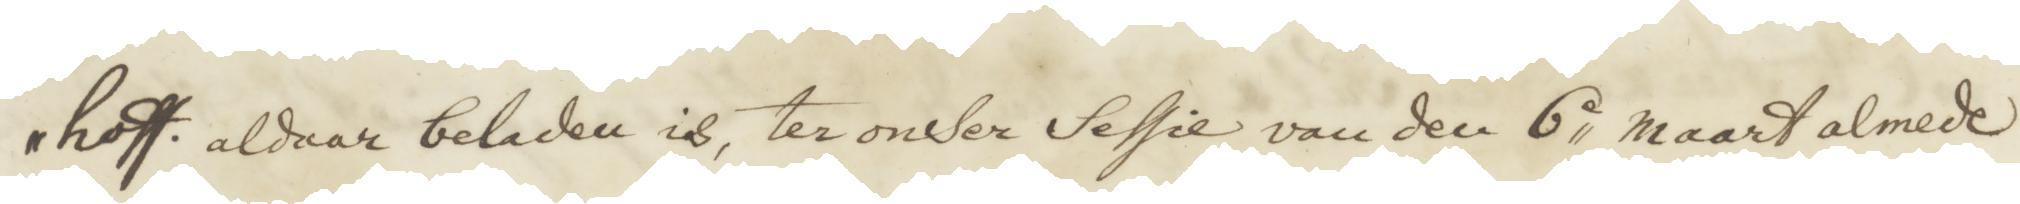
„hoff. aldaar beladen is, ter onser sessie van den 6„e maart almede
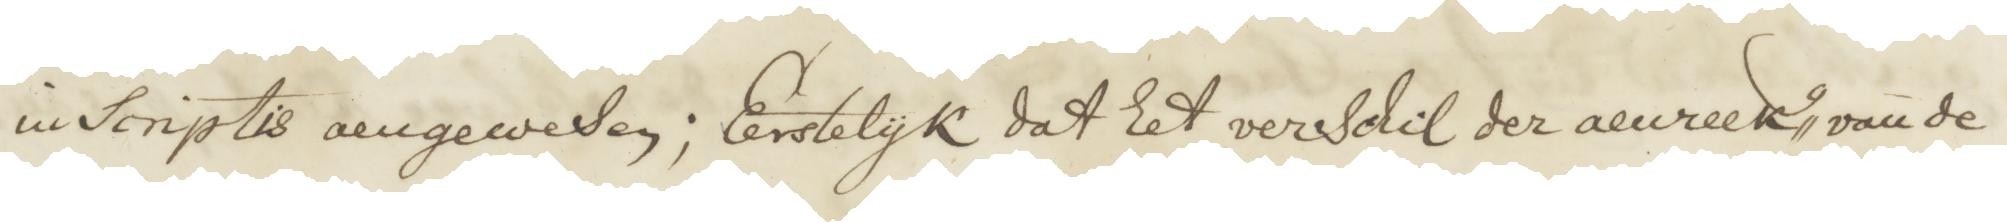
in scriptis aengewesen; Eerstelijk dat het verschil der aenreek„g van de
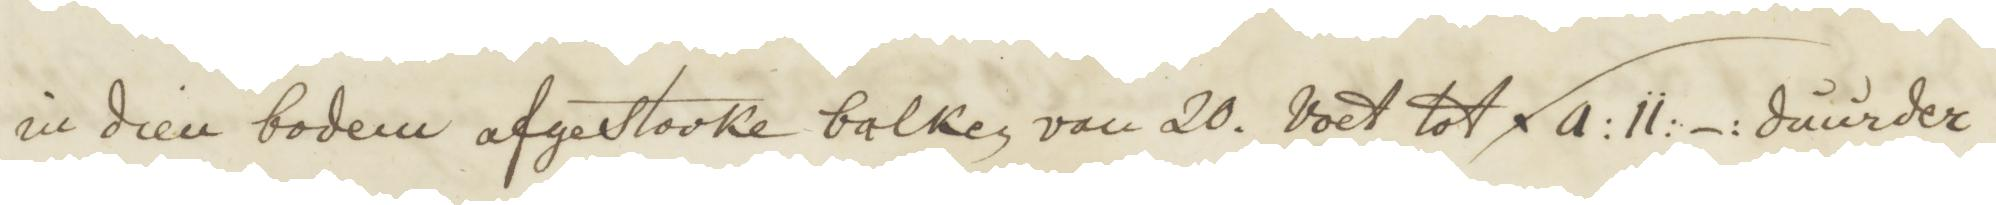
in dien bodem afgestooke balken van 20. voet tot ƒ4:11:—: duurder
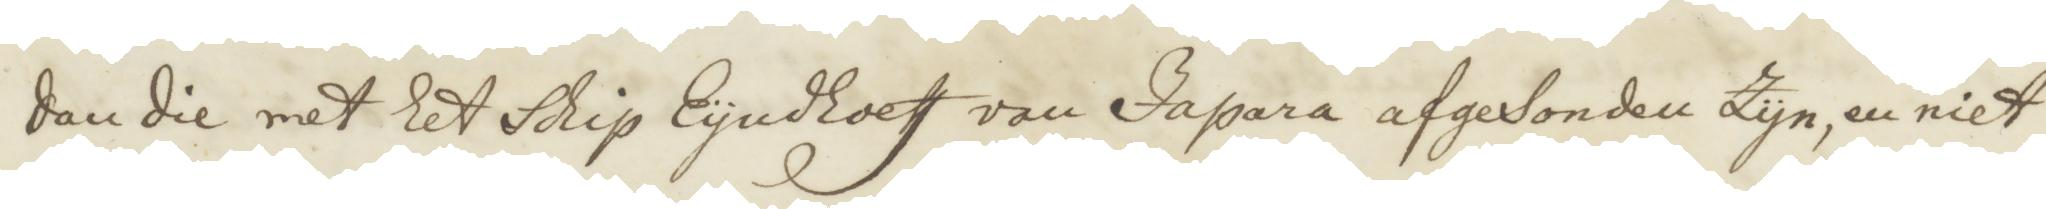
dan die met het schip Eijndhoeff van Japara afgesonden zijn, en niet
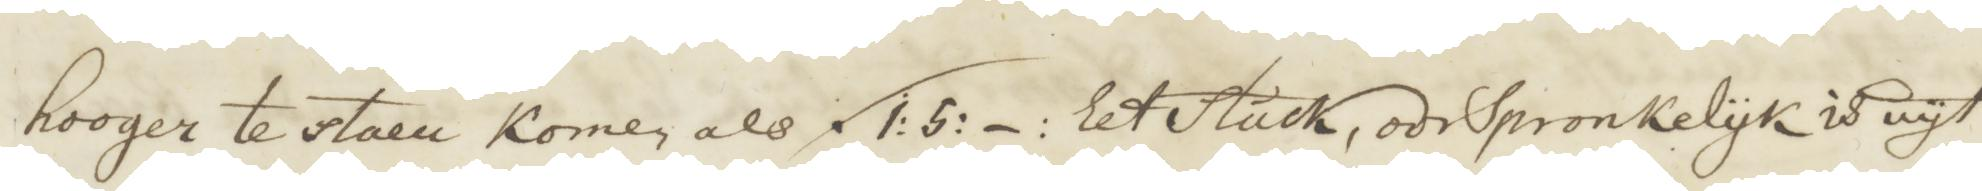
hooger te staen komen als ƒ1:5:—: het stuck, oorspronkelijk is uijt
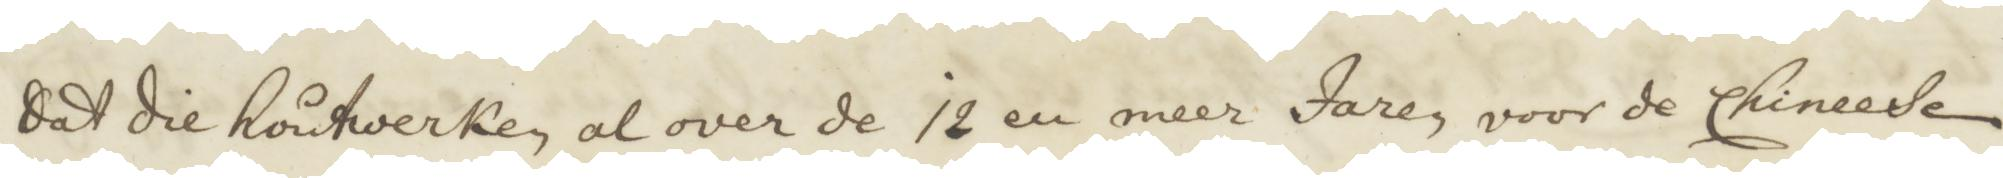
dat die houtwerken al over de 12 en meer Jaren voor de Chineese
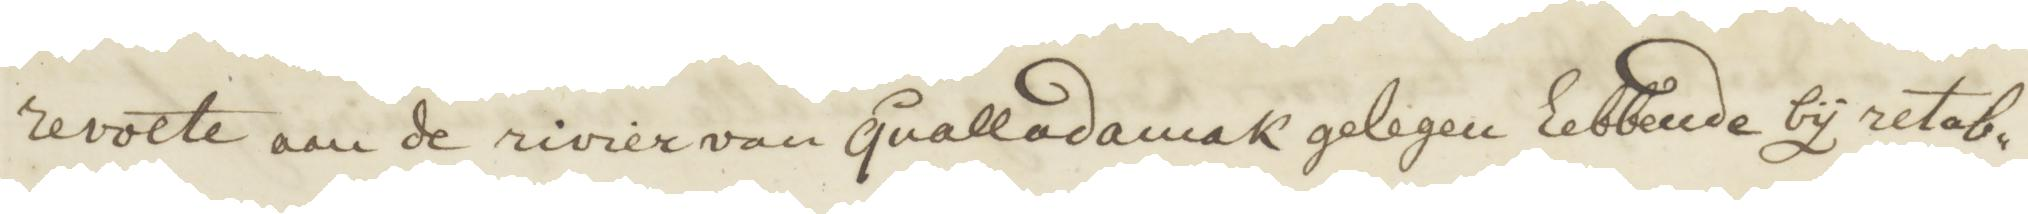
revolte aan de rivier van qualladamak gelegen hebbende bij retab„
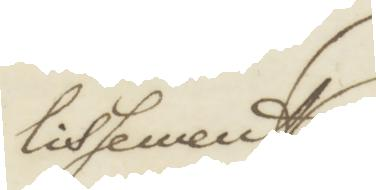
lissement
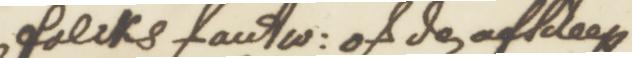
folcks verantw: over den afscheep
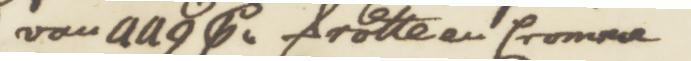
van 449 p„s verrotte en Cromme
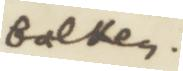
balken.
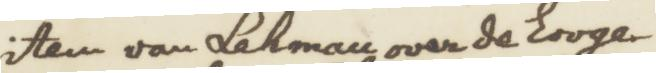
item van Lehman over de hooge
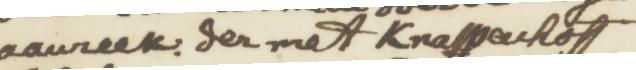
aanreek: der met knappenhoff
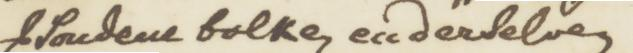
versondene baken en derselven
